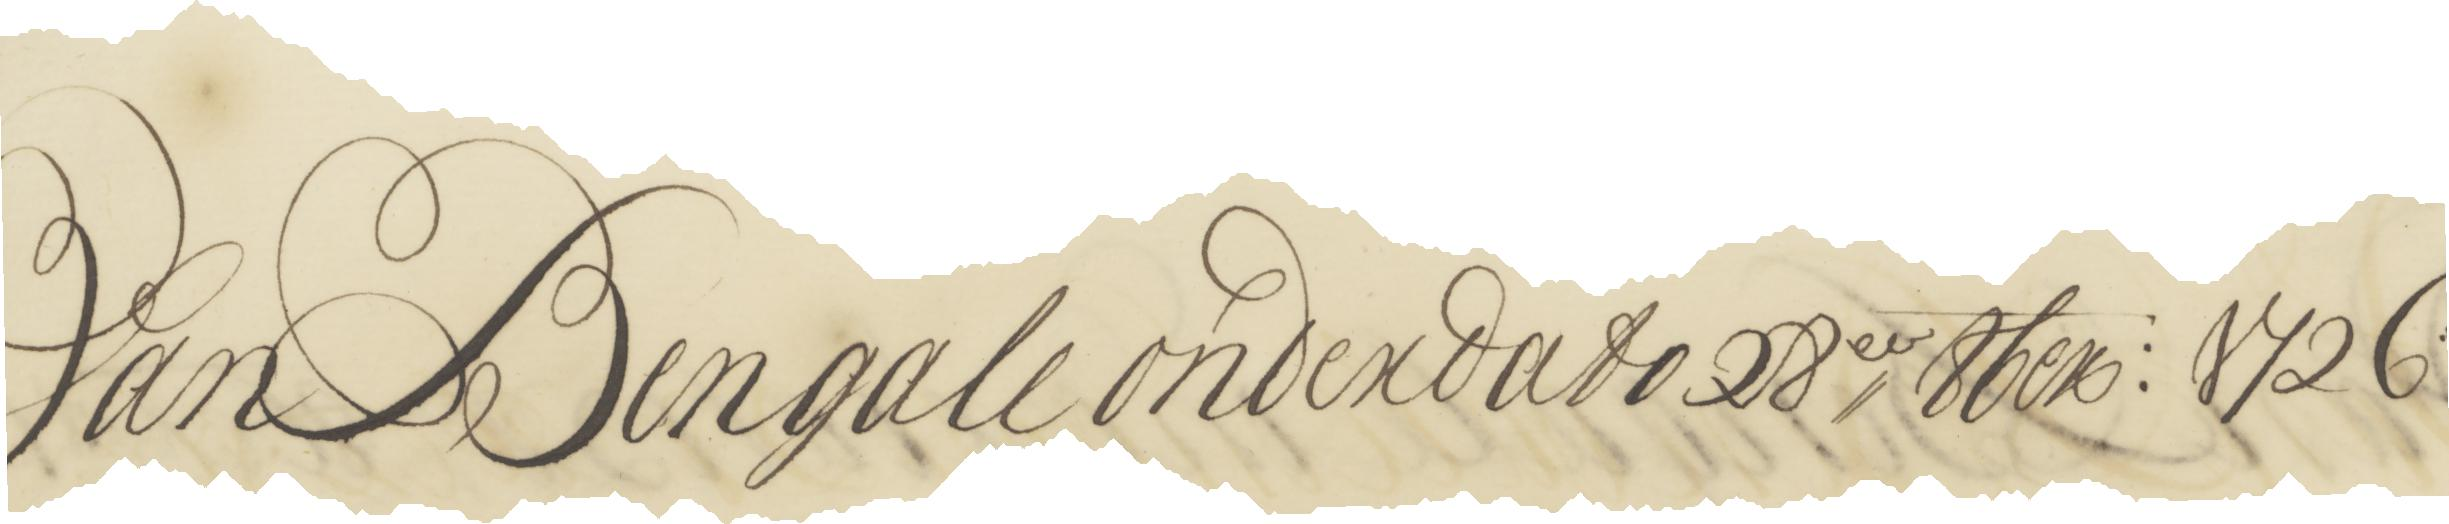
Van Bengale onder dato 28„en 8ber: 1726
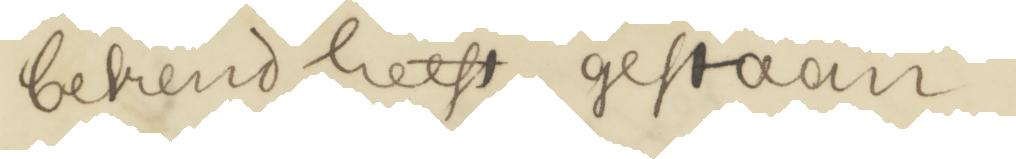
bekend heeft gestaan
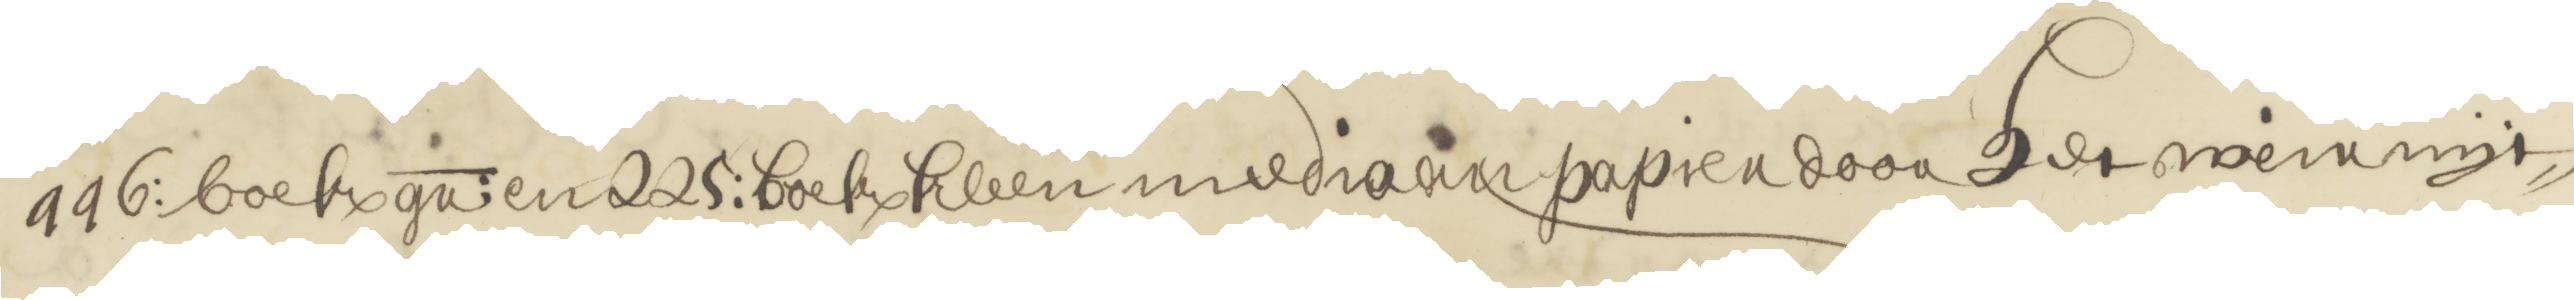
446: boek gr: en 225: boek kleen mediaan papier door het weir uijt„
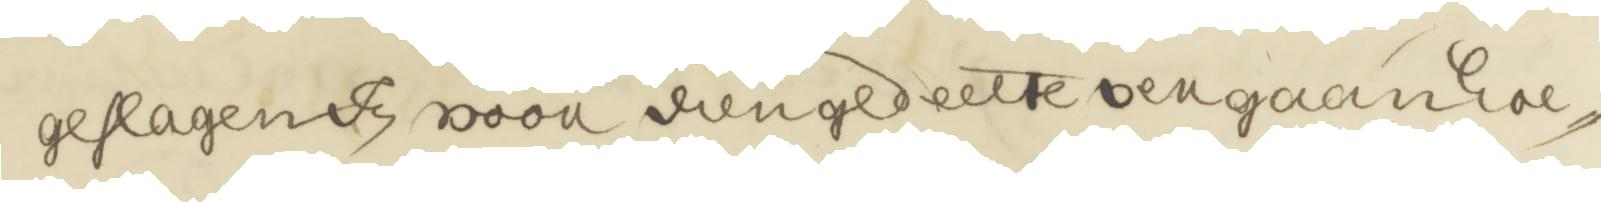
geslagen En voor een gedeelte vergaan hoe„
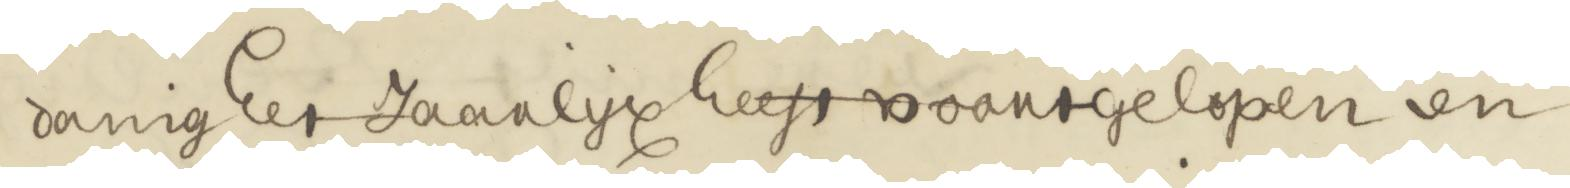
danig het Iaarlijx heeft voortgelopen en
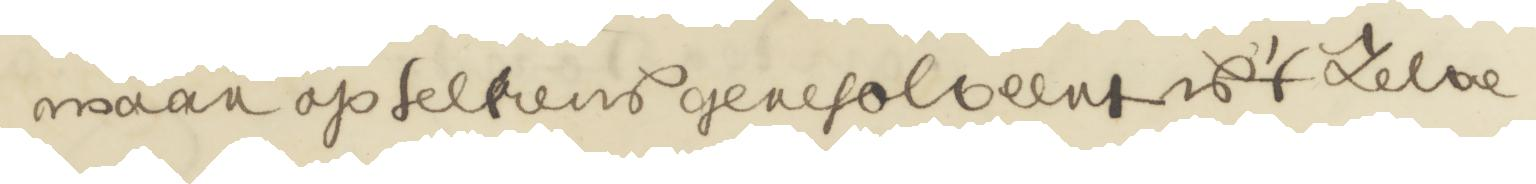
waar op telkens geresolveert is 't zelve
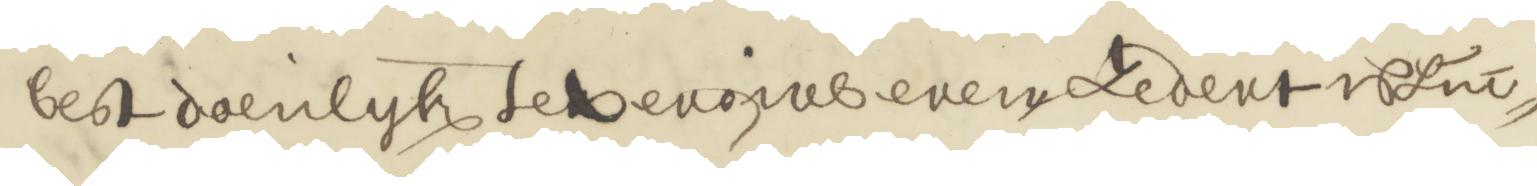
best doenlyk te veroirberen zedert is suc„
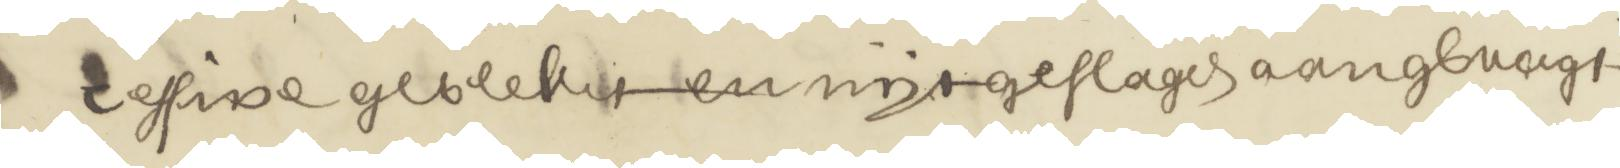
cessive gevlekt en uijtgeslagen aangbragt
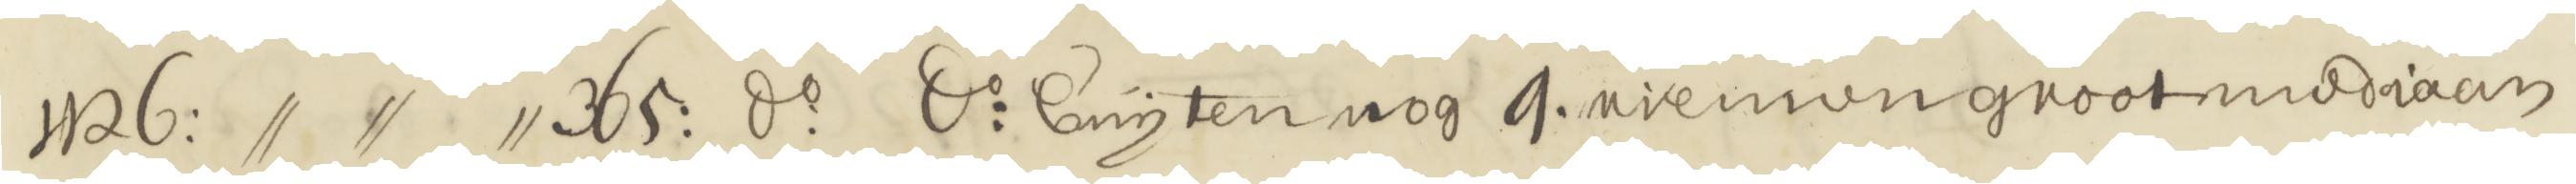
1126: „ „ „ 365: d:o d:o buijten nog 4. riemen groot mediaan
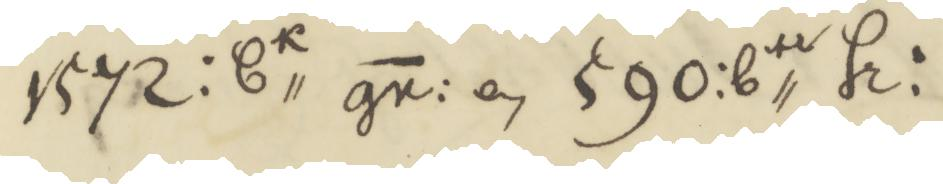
1572: b„r gr: en 590: b„te k:
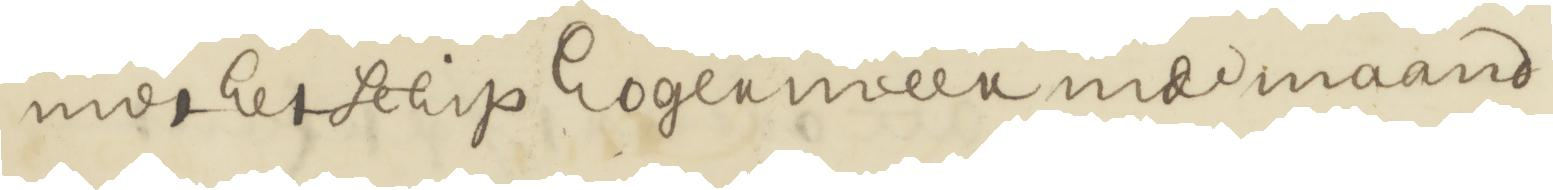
met het schip hogermeer inde maand
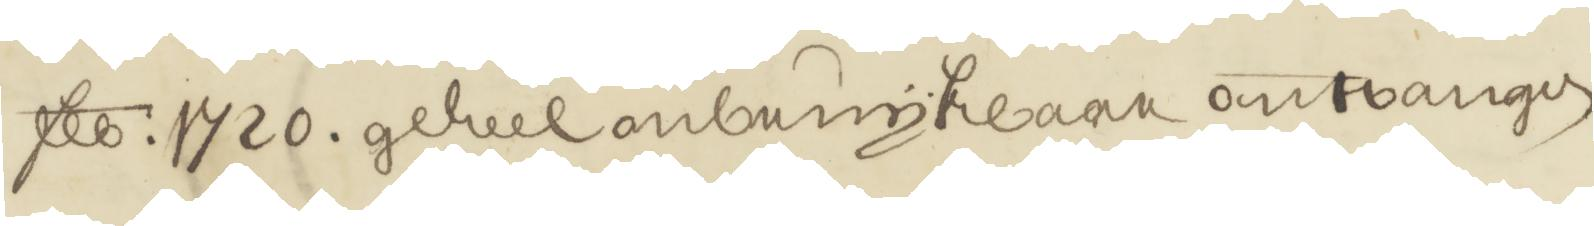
feb: 1720. geheel onbruijkbaar ontvangen
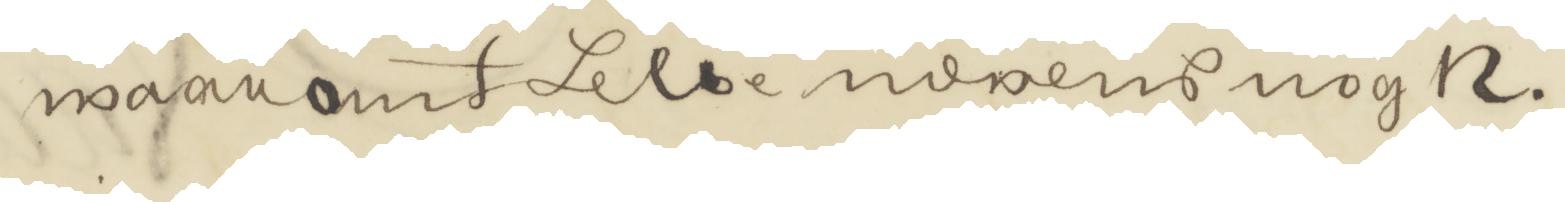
waar om 't selve nevens nog 12.
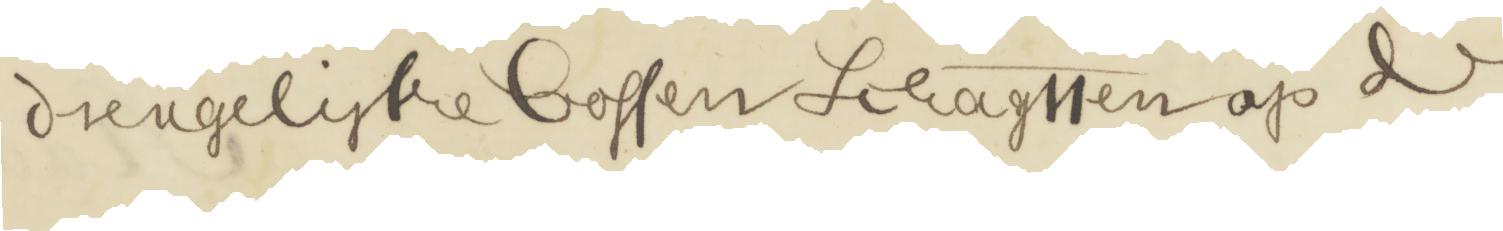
diergelijke bossen schagtten op de
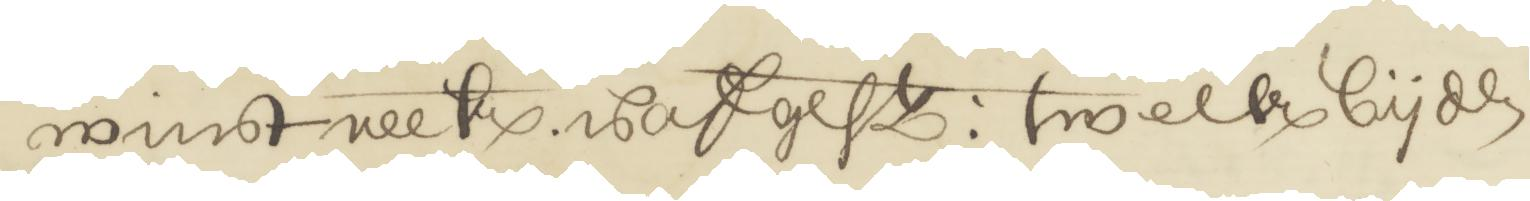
winst reek. is afgesz: twelk bij den
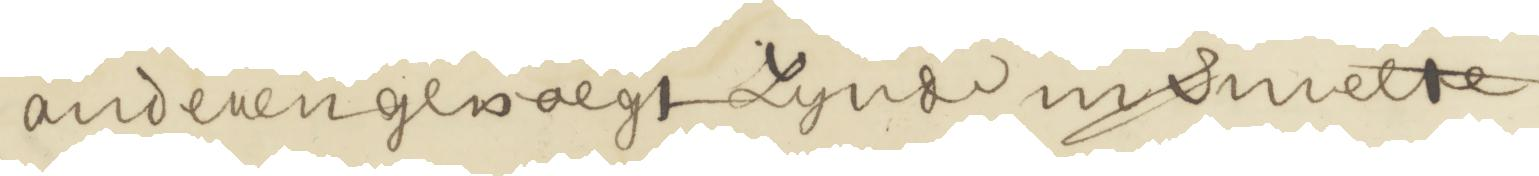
anderen gevoegt zynde in vermelte
